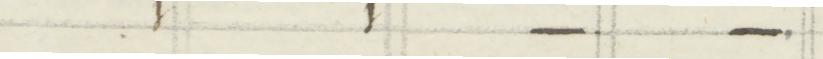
1 1 —. —.
